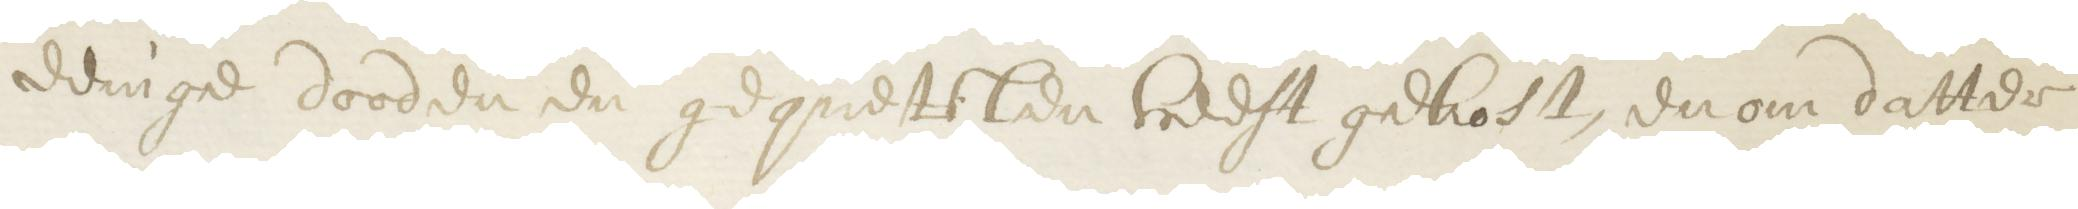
eenige dooden en gequetsten heeft gekost, en om datter
